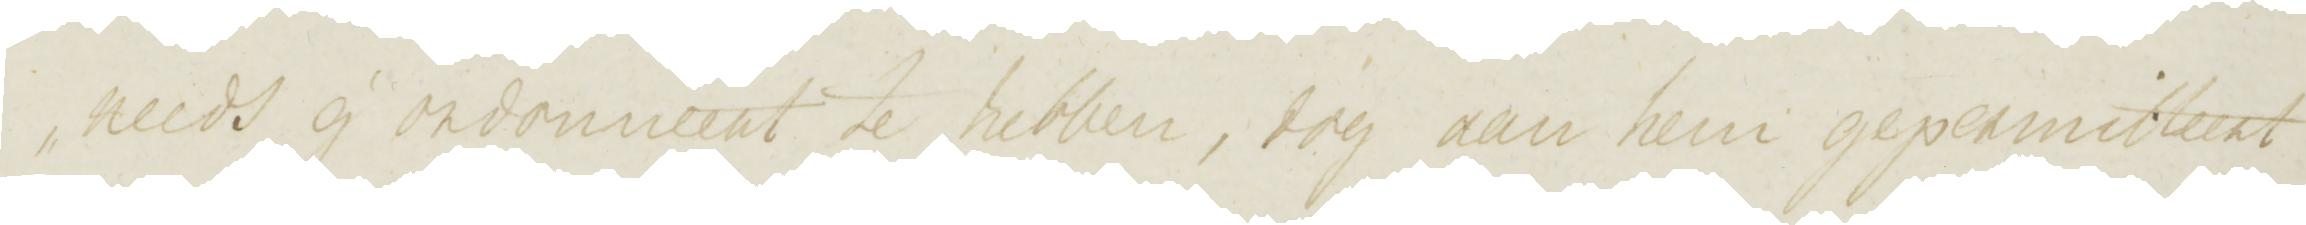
„reeds g’ordonneert te hebben, dog aan hem gepermitteert
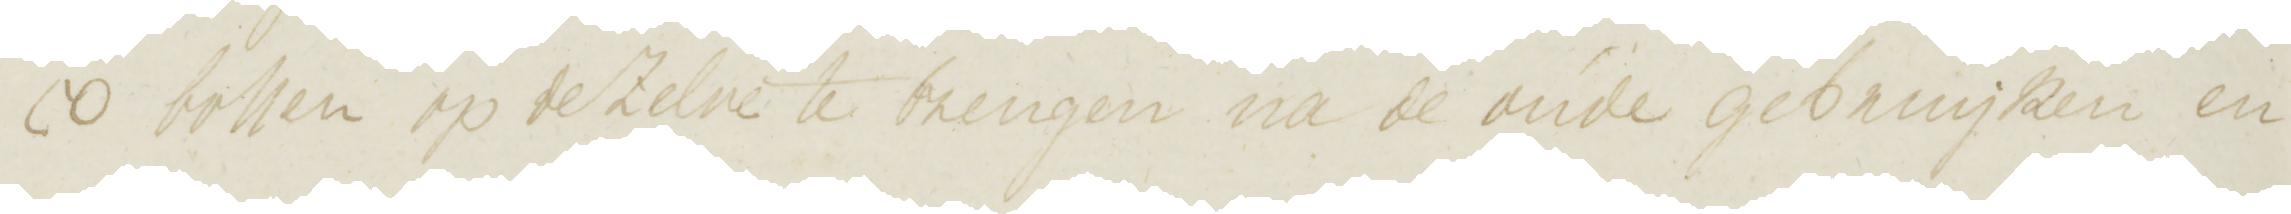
50 bossen op de zelve te brengen na de oude gebruijken en
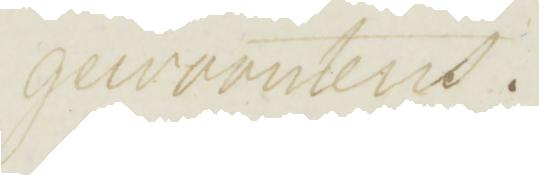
gewoontens.
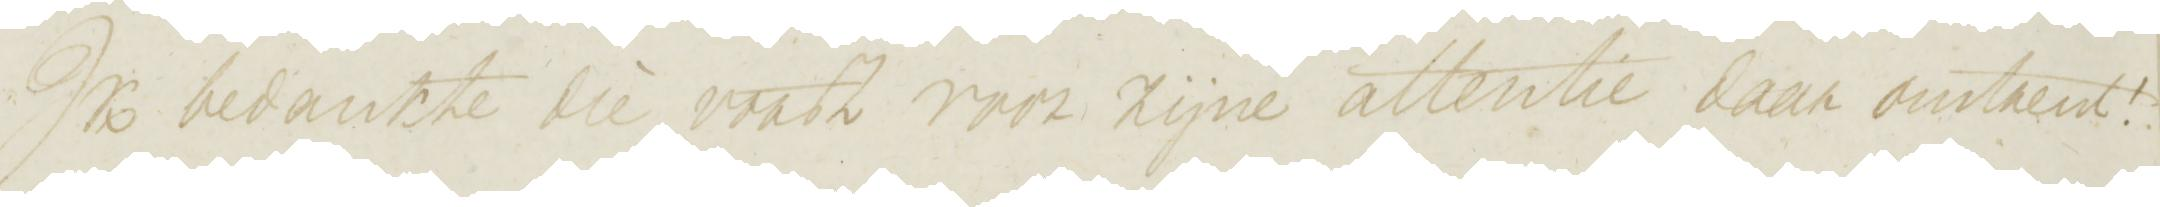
Jk bedankte die vorst voor zijne attentie daar omtrent!
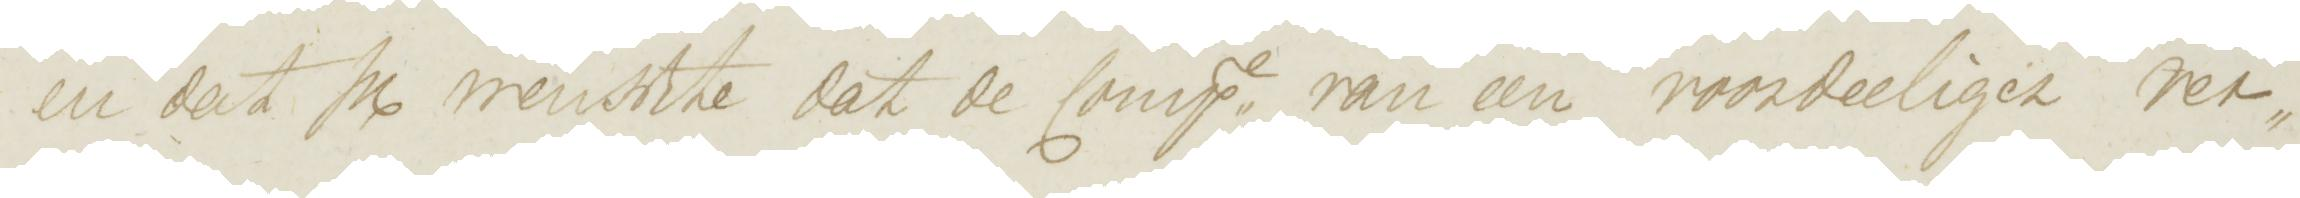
en dat jk wenschte dat de Comp„e van een voordeeliger ver„
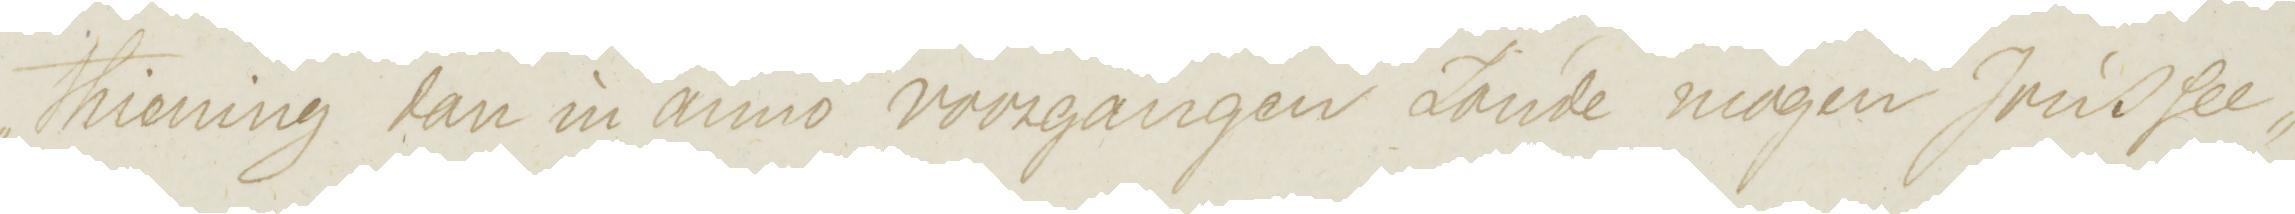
thiening dan in anno voorgangen zoude mogen Joussee„
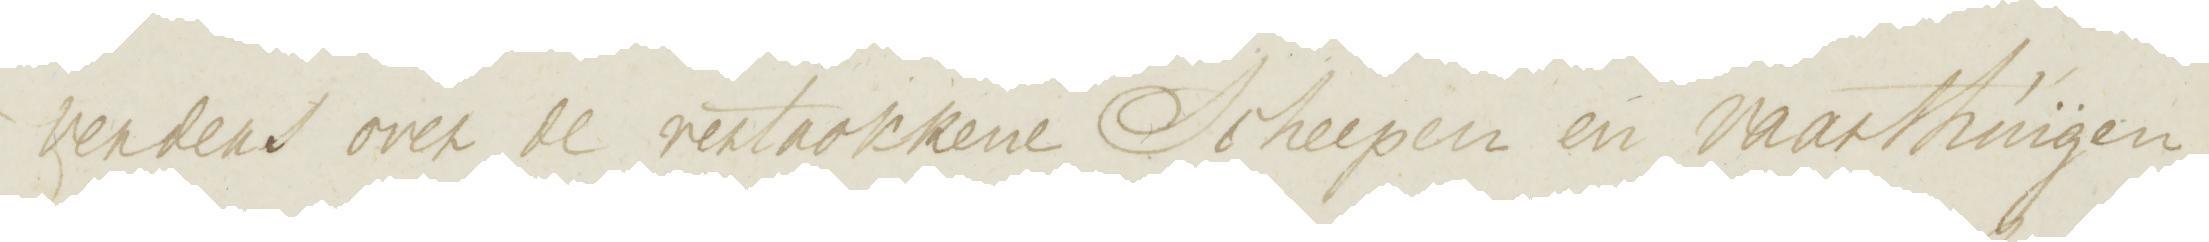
verders over de vertrokkene scheepen en vaarthuigen
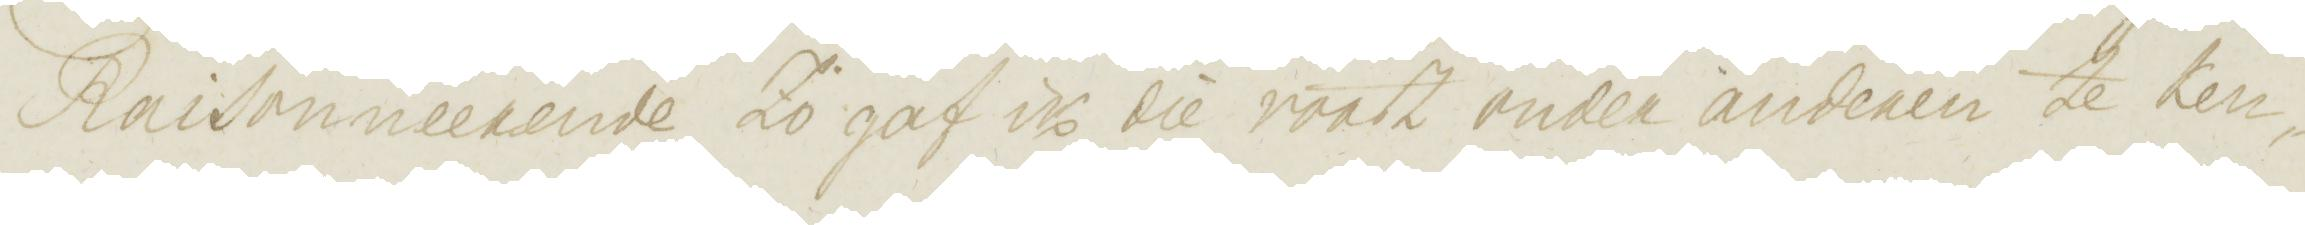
Raisonneerende zo gaf ik die vorst onder anderen te ken„
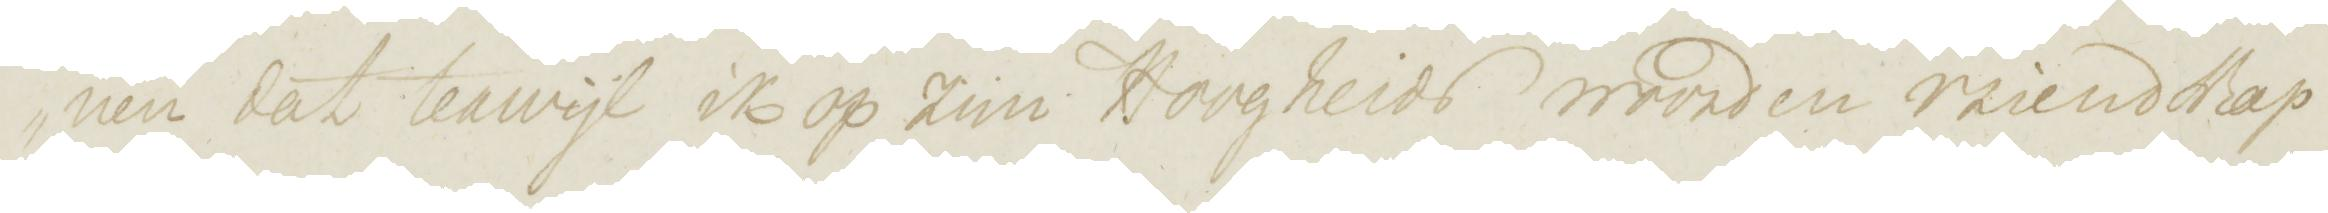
„nen dat terwijl ik op zijn Hoogheids woorden vriendschap
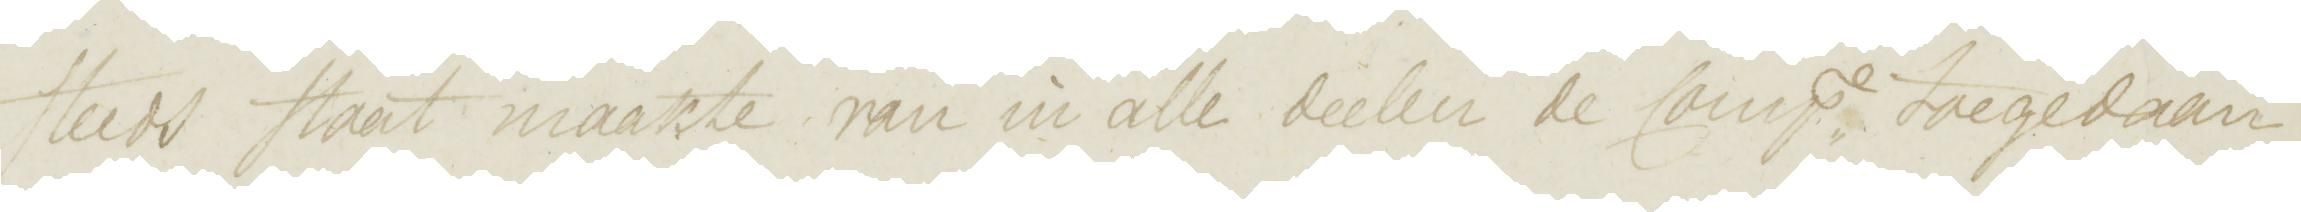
steeds staat maakte van in alle deelen de Comp„e toegedaan
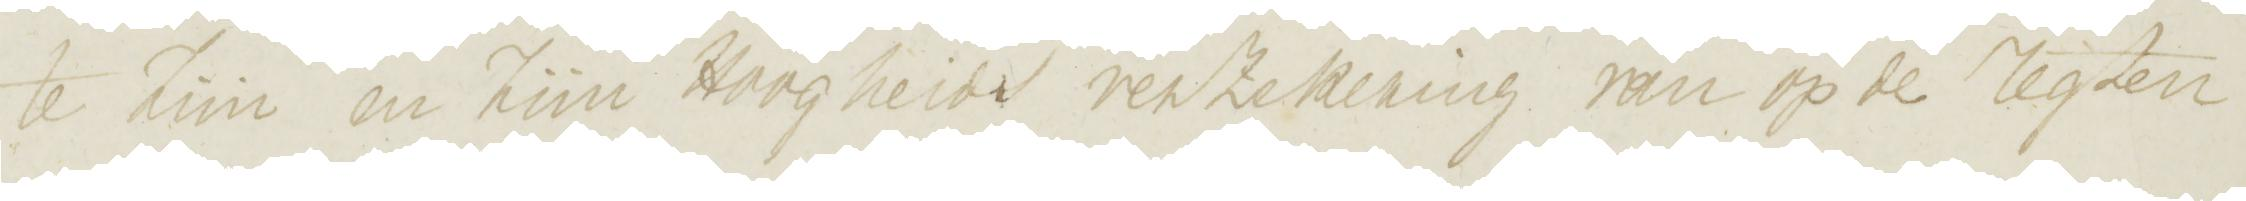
te zijn en zijn Hoogheids verzekering van op de regten
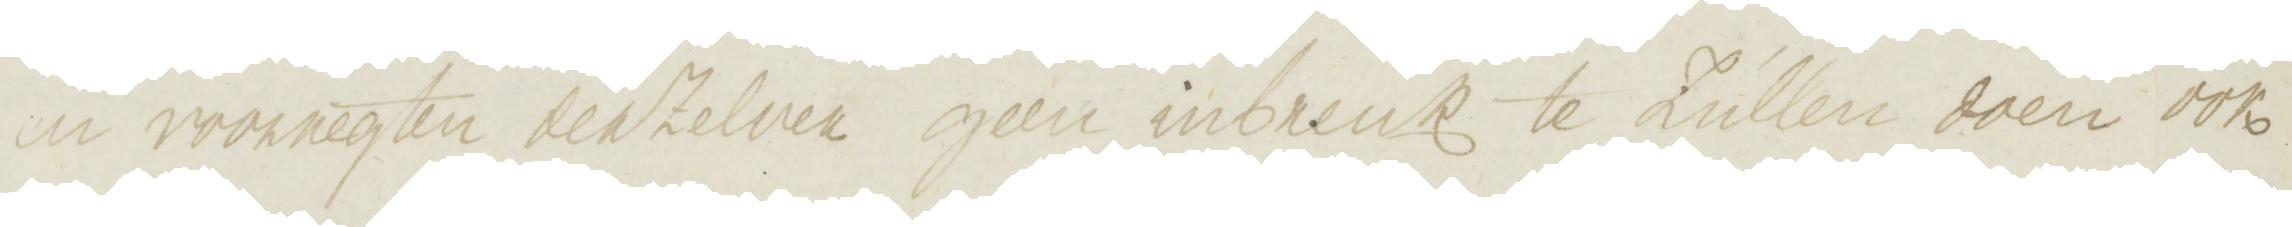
en voorregten derzelver geen inbreuk te zullen doen ook
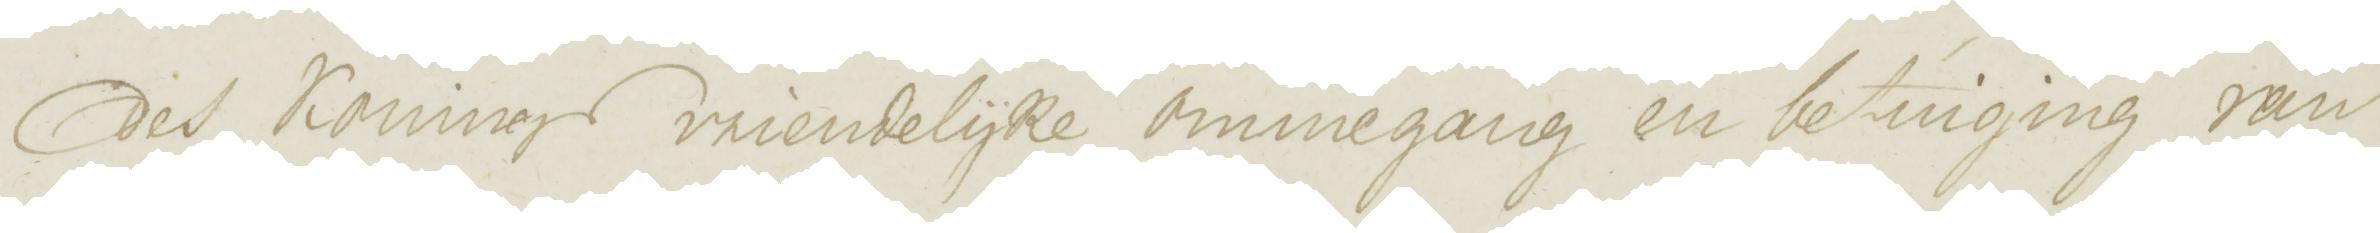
des konings vriendelijke ommegang en betuiging van
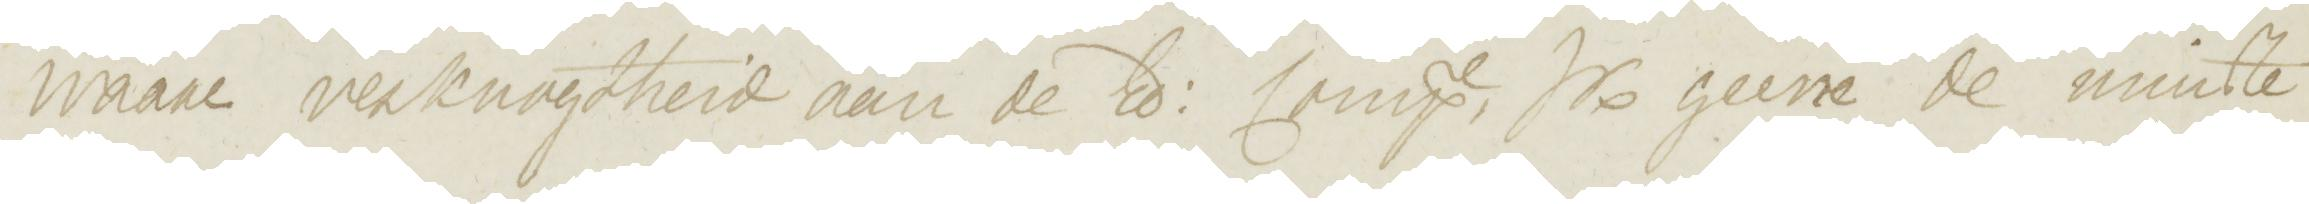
waare verknogtheid aan de Ed: Comp:e jk geene de minste
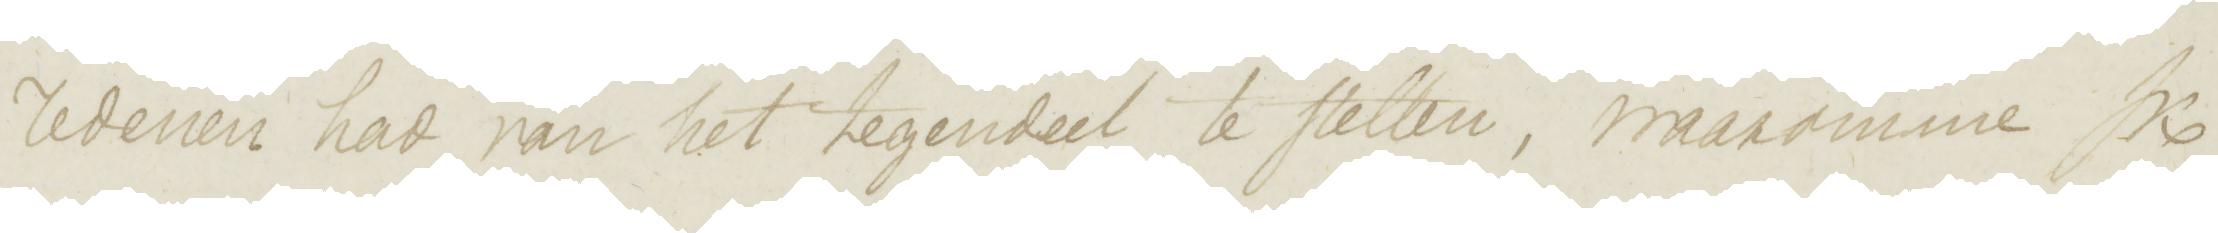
redenen had van het tegendeel te stellen, waaromme jk
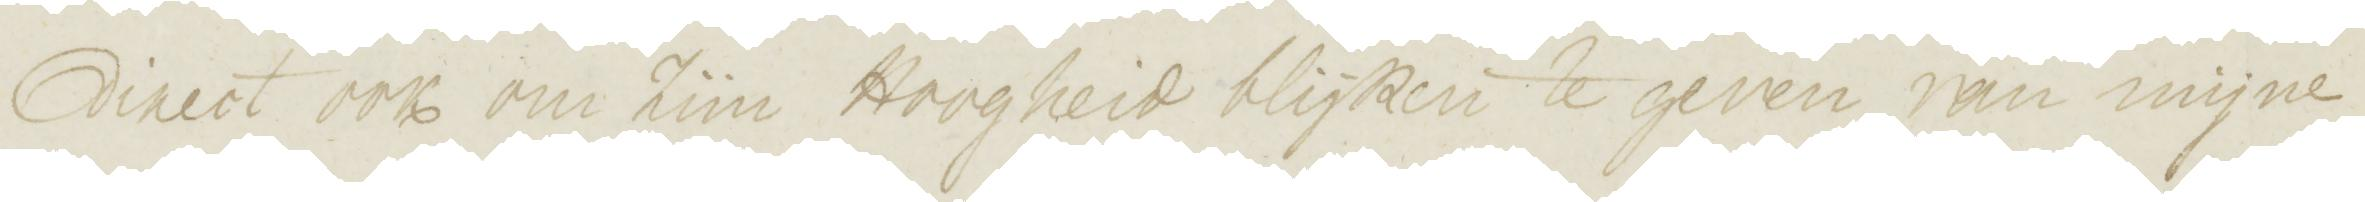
direct ook om zijn Hoogheid blijken te geven van mijne
